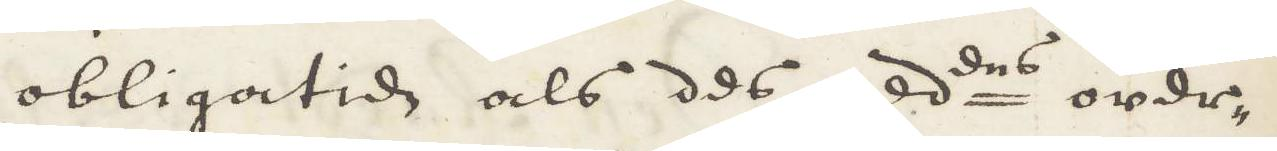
obligatien als des ged=ens over„
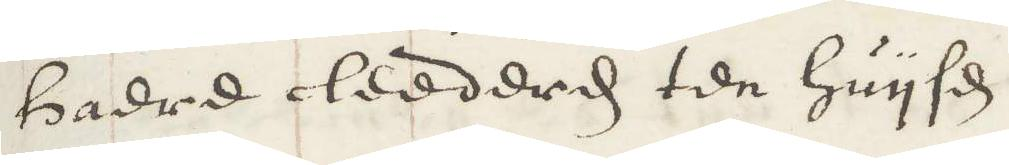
haere cleederen ter huijsen
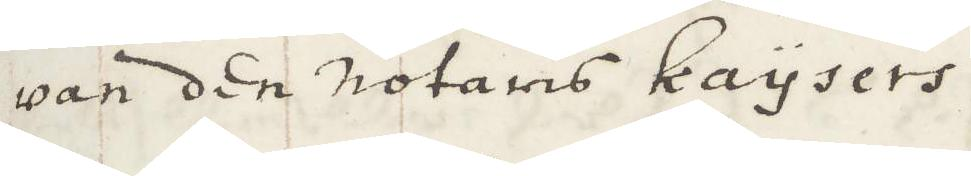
van den notaris kaijsers
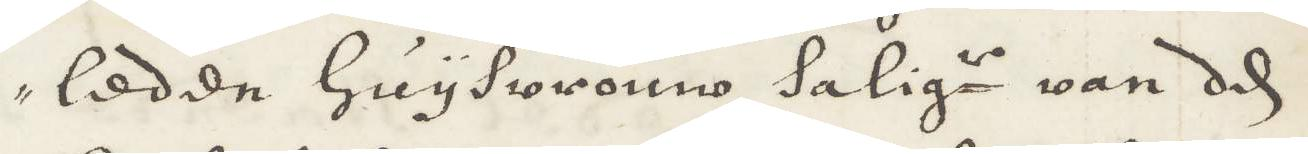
„leden huijsvrouw salig=r van den
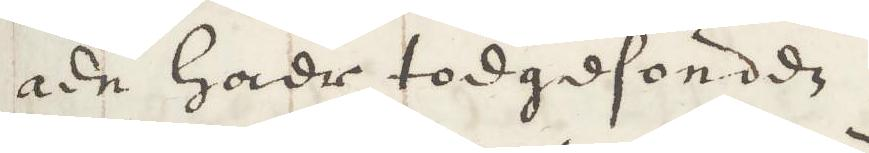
aen haer toegesonden
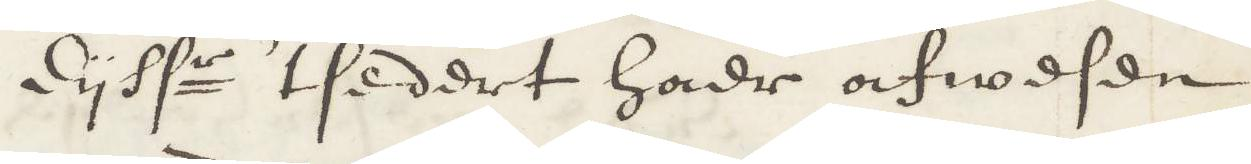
Eijss=r ’tsedert haer afwesen
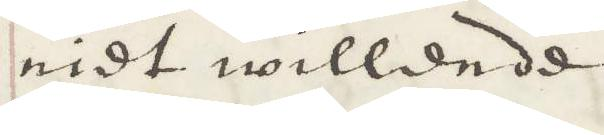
niet willende
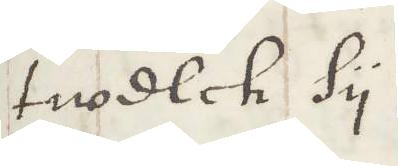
twelck sij
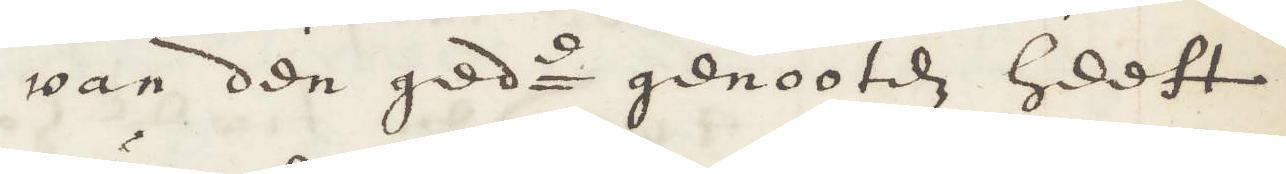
van den ged=e genooten heeft.
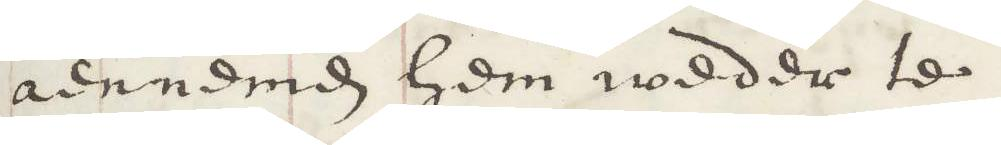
aennemen hem weder te
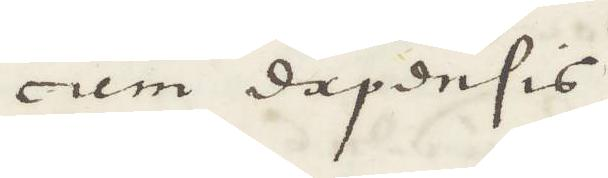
cum expensis
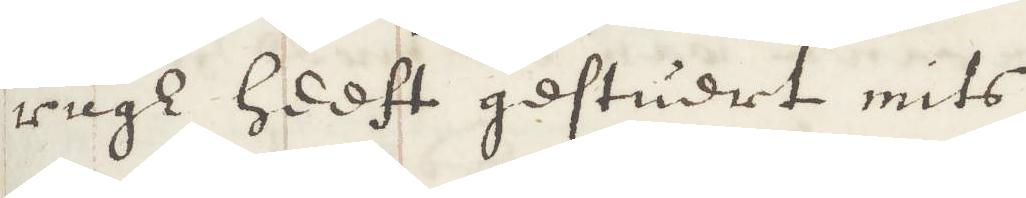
rugh heeft gestuert mits
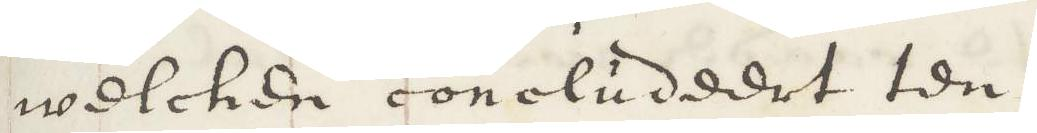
welcken concludeert ten
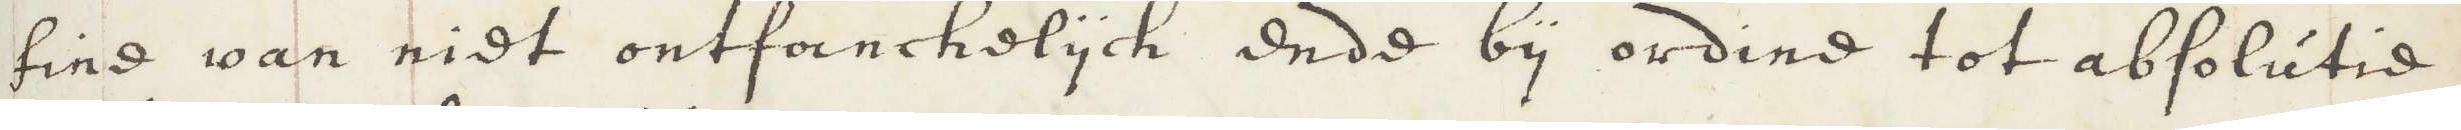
fine van niet ontfanckelijck ende bij ordine tot absolutie
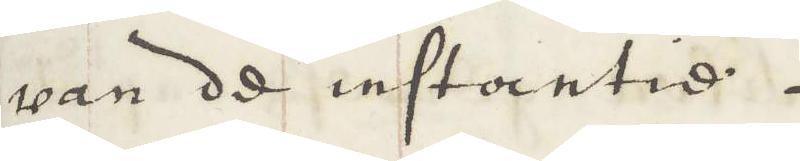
van de instantie.
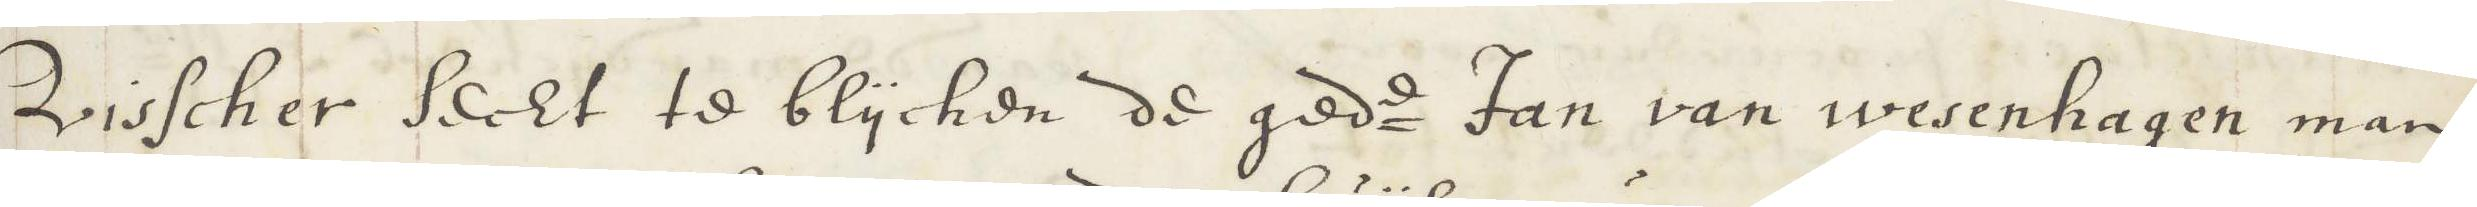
visscher secht te blijcken de ged=e Tan van wesenhagen man
